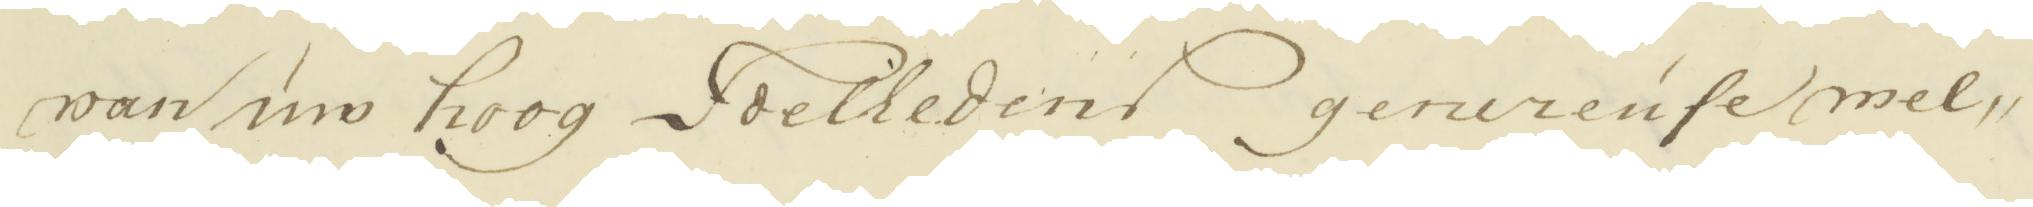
van uw hoog Edelhedens genereuse wel„
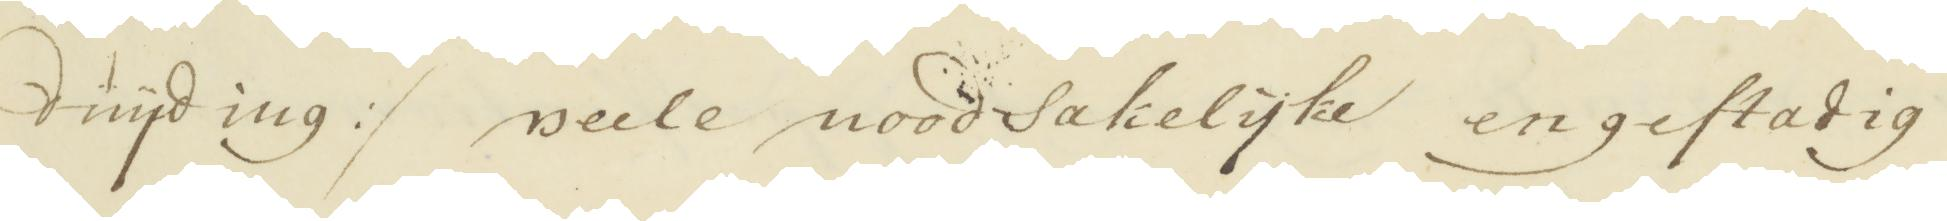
duijding :/ veele noodsakelijke en gestadig
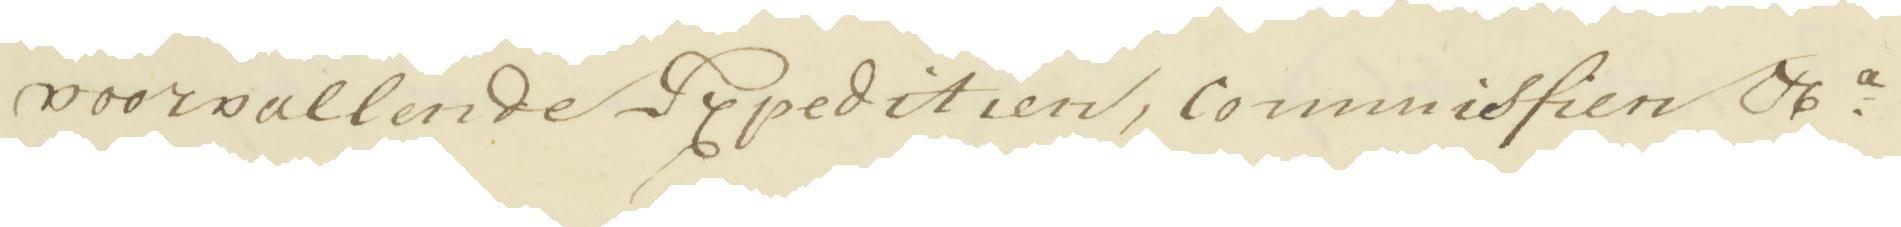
voorvallende Expeditien, commissien &c=a
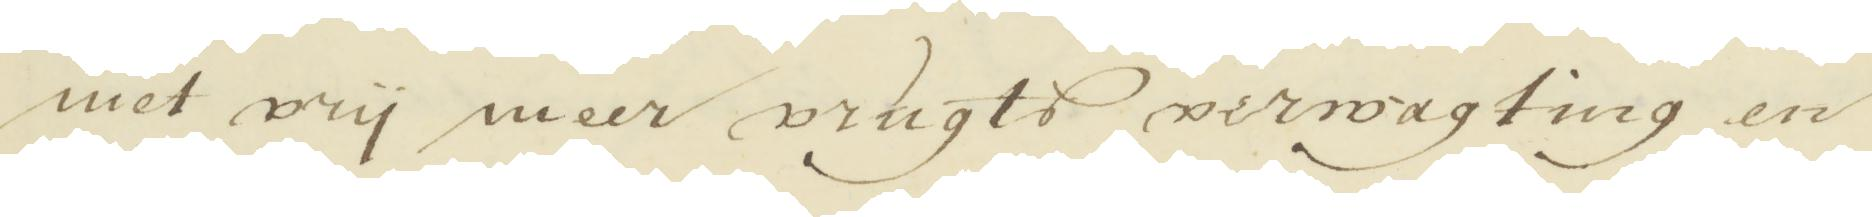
met vrij meer vrugts verwagting en
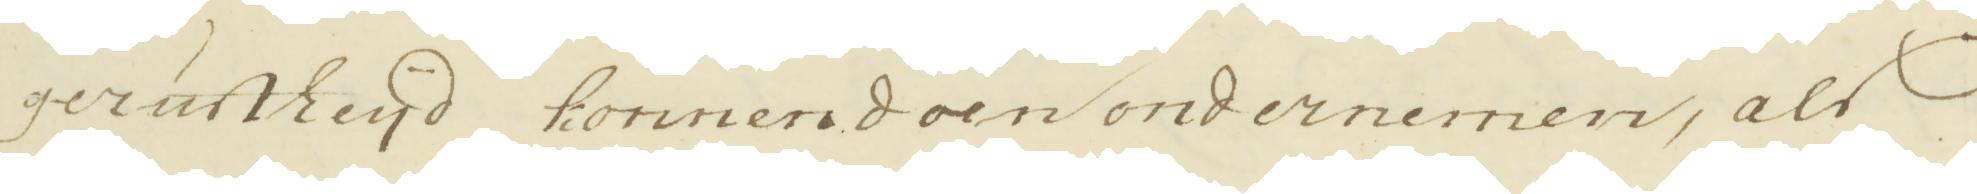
gerustheijd konnen doen ondernemen, als
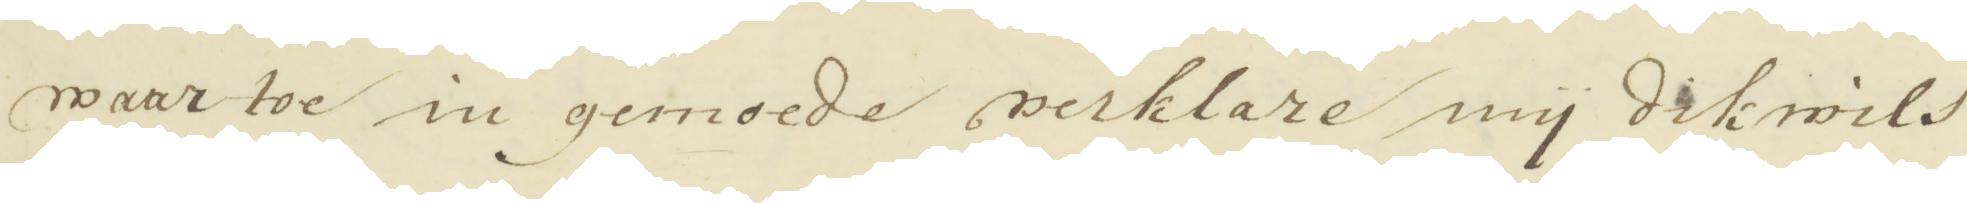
waar toe in gemoede verklare mij dikwils
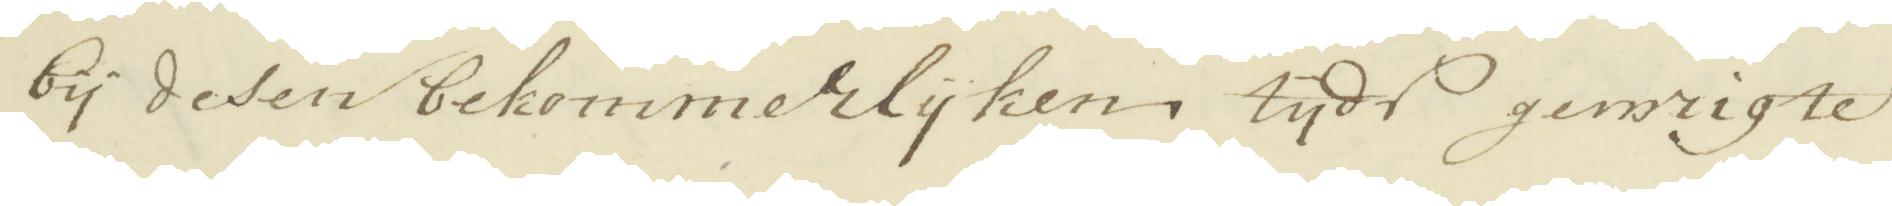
bij desen bekommerlijken tijds gewrigte
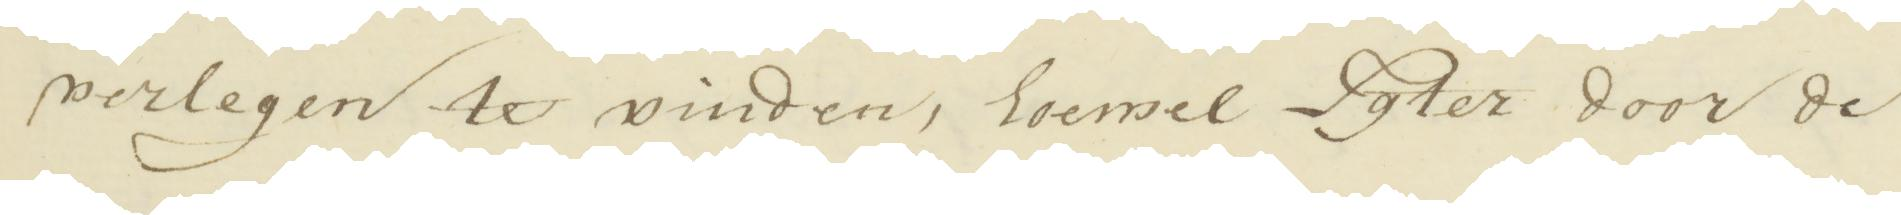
verlegen te vinden, hoewel Egter door de
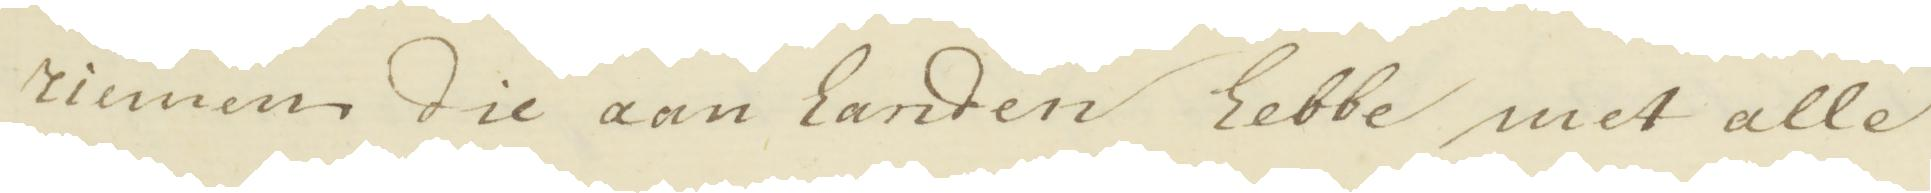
riemen die aan handen hebbe met alle
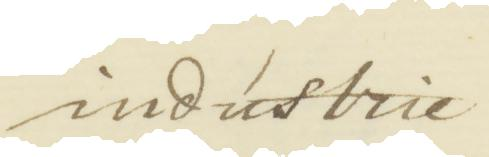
industrie
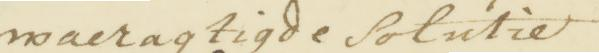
waeragtigde solutie
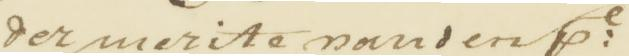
der merite van den p:l
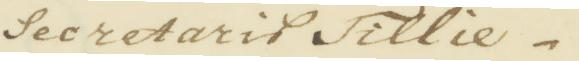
secretaris Tillie -
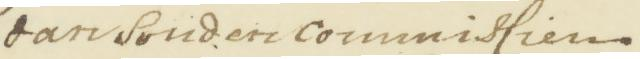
dan souden commissien
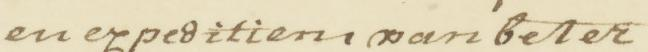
en expeditien van beter
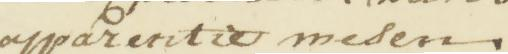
apparentie wesen.
